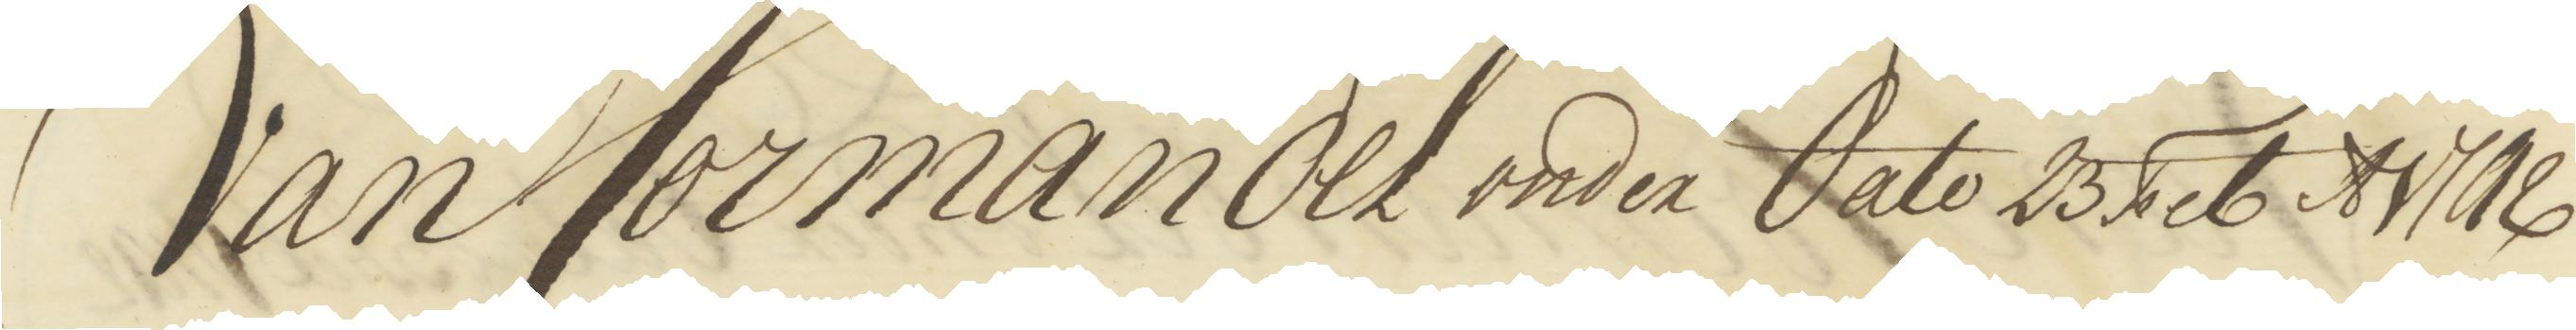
Van Cormandel onder dato 23 Feb A1742
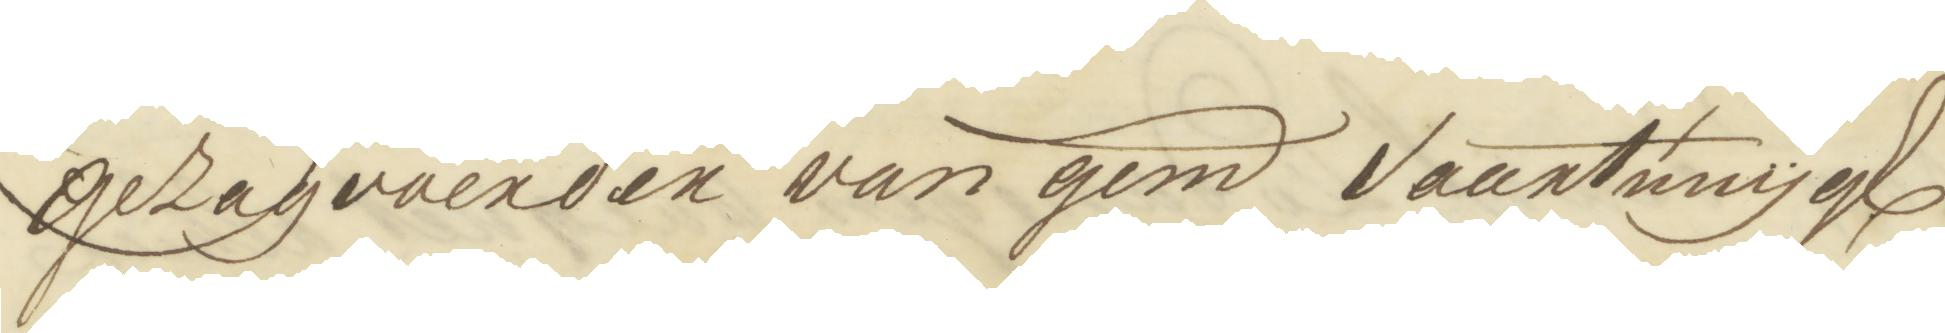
gezagvoerder van gem vaartuuijgh
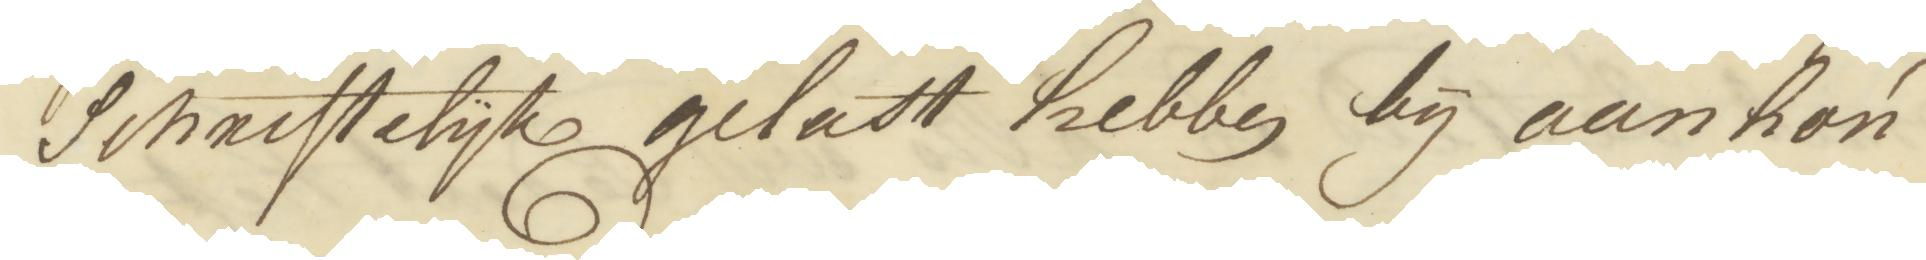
schriftelijk gelast hebben bij aan hou
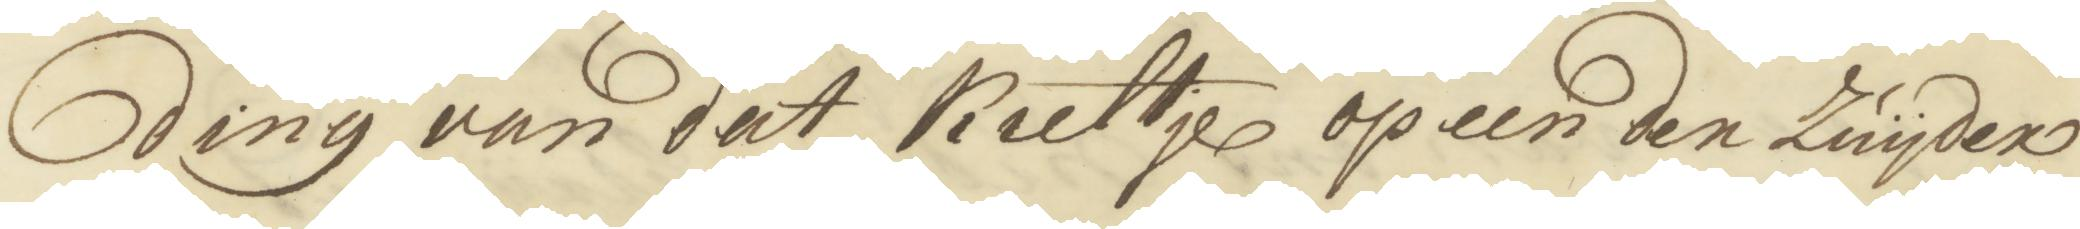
ding van dat kieltje op een den zuijder
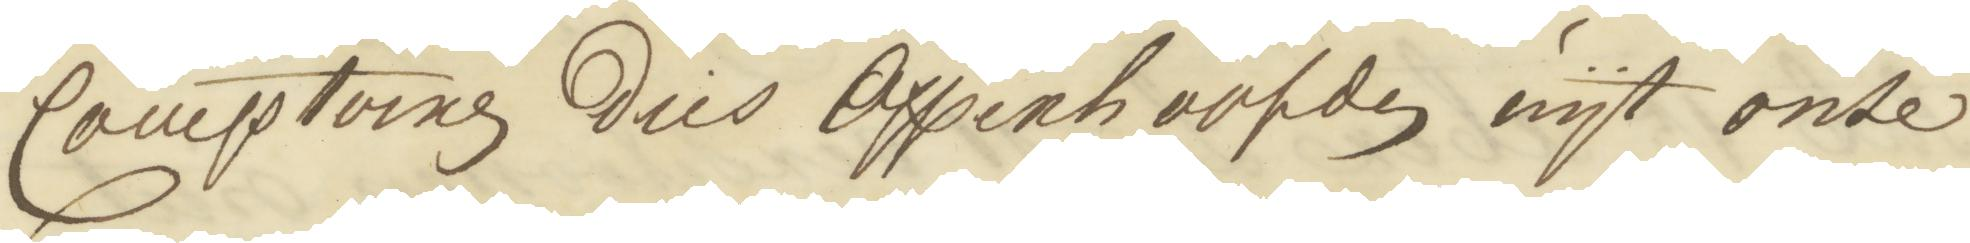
Comptoiren dies Opperhoofden uijt onse
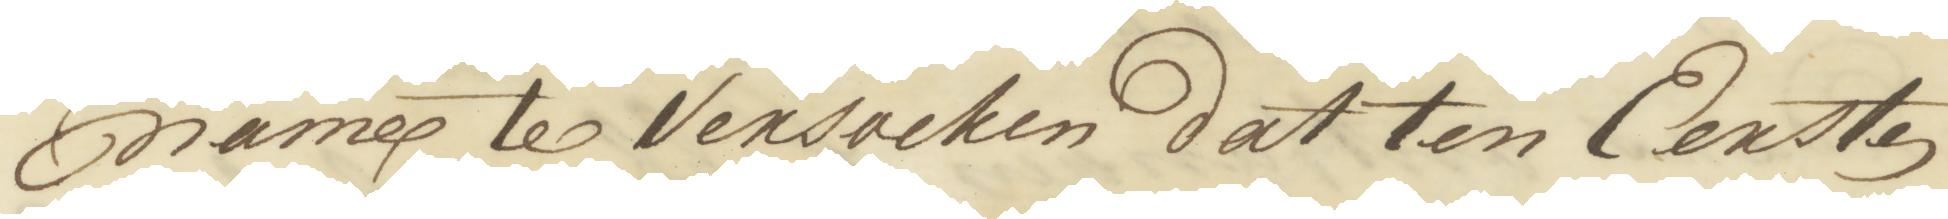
name te versoeken dat ten Eersten
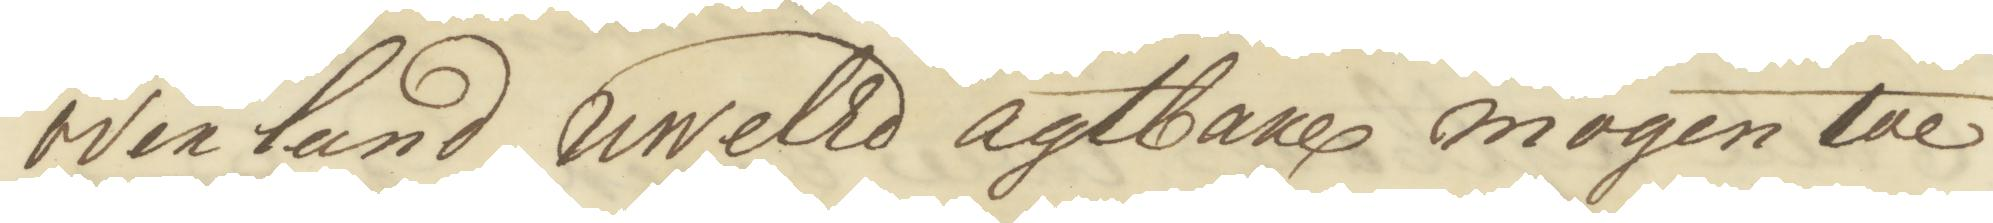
over land uwelEd agtbare mogen toe
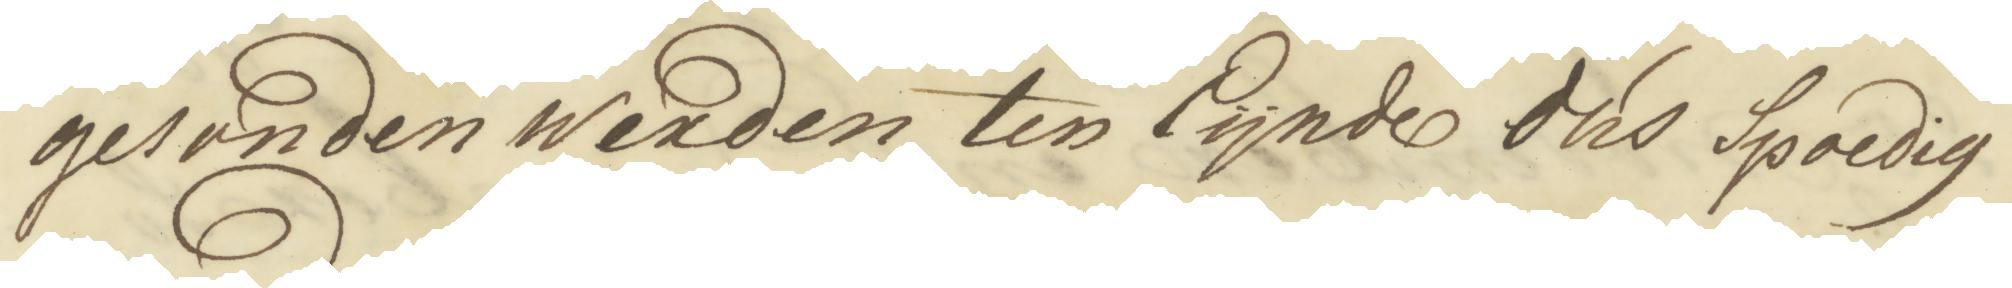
gesonden werden ten Eijnde dus spoedig
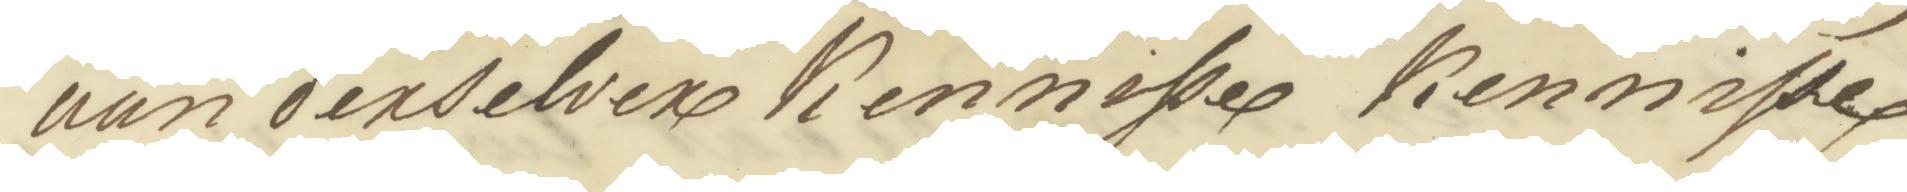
aan derselver kennisse kennisse
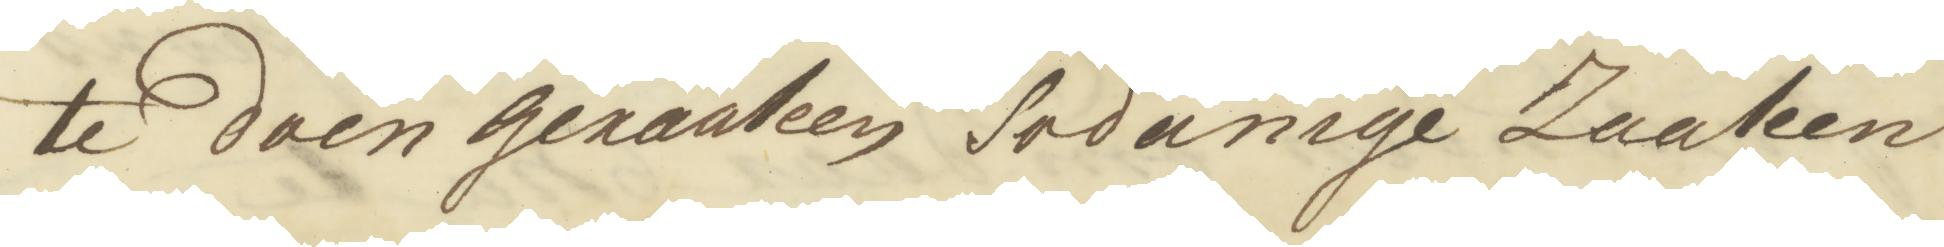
te doen geraaken sodanige zaaken
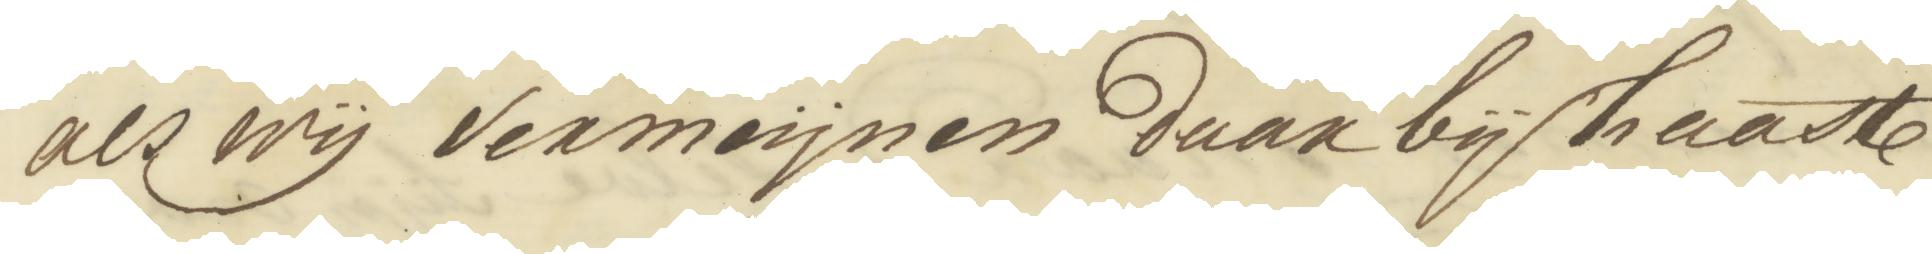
als wij vermeijnen daar bij haast
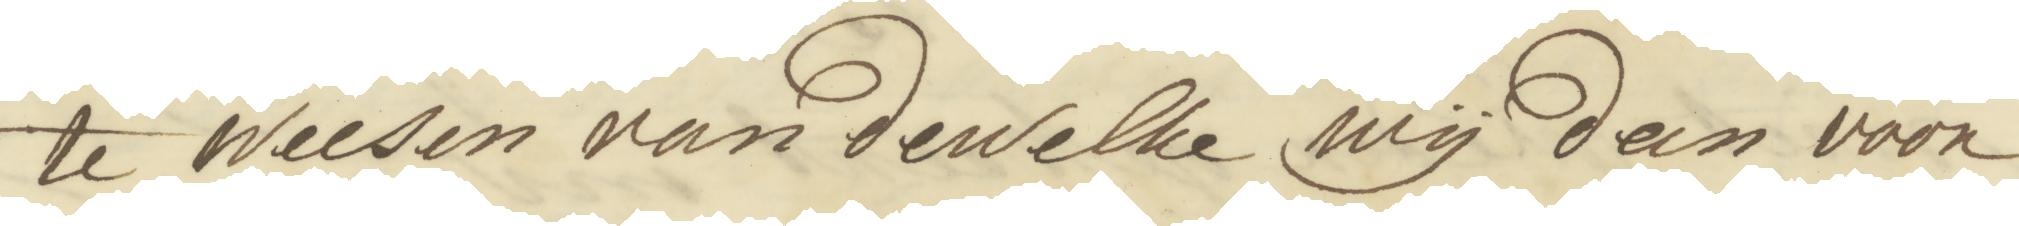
te weesen van dewelke wij dan, voor
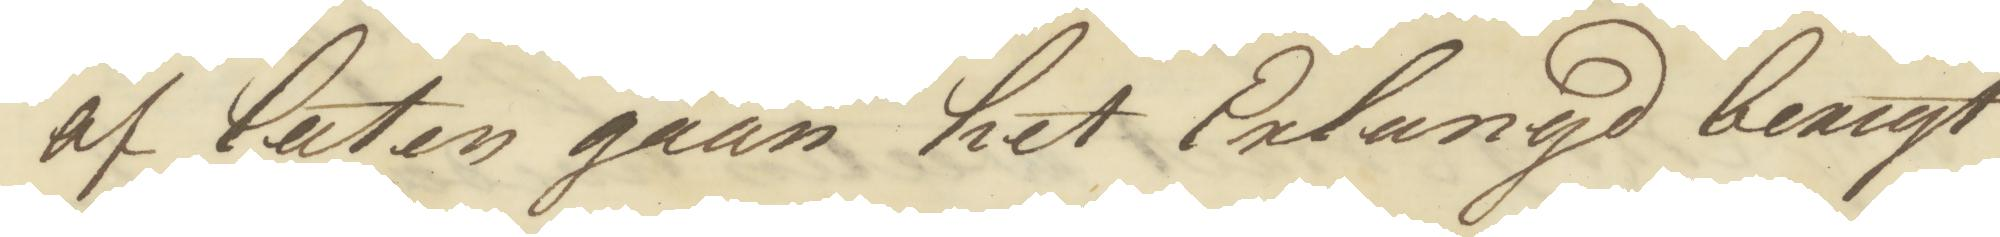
af laten gaan het Erlangd berigt
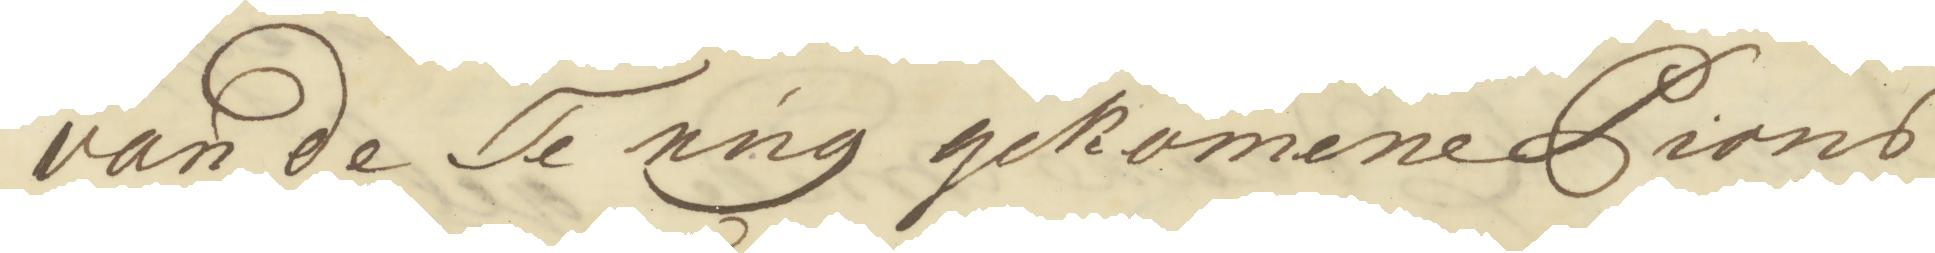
van de Te rug gekomene Pions
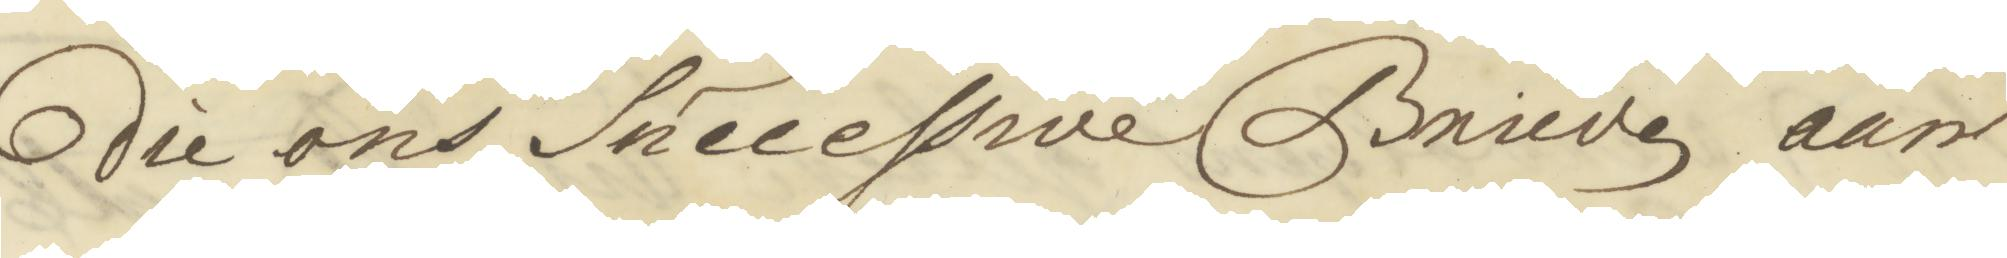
die ons successive Brieven aan
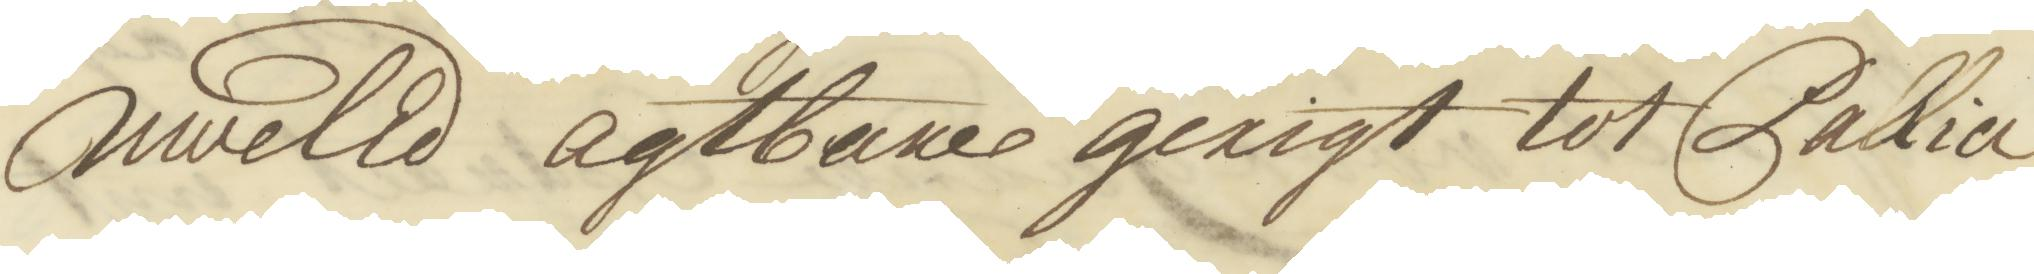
uwelEd agtbare gerigt tot Pallia
